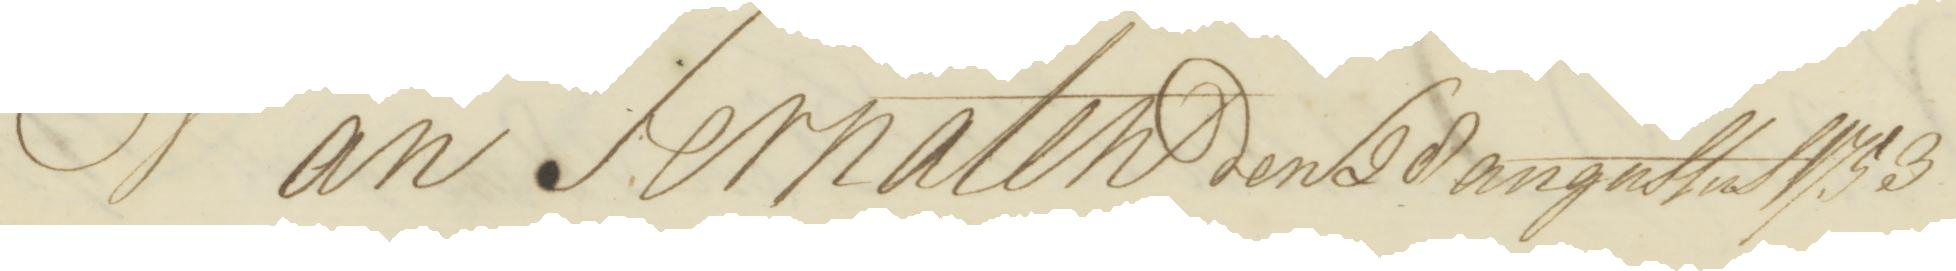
Van Ternaten den 28 augustus 1753
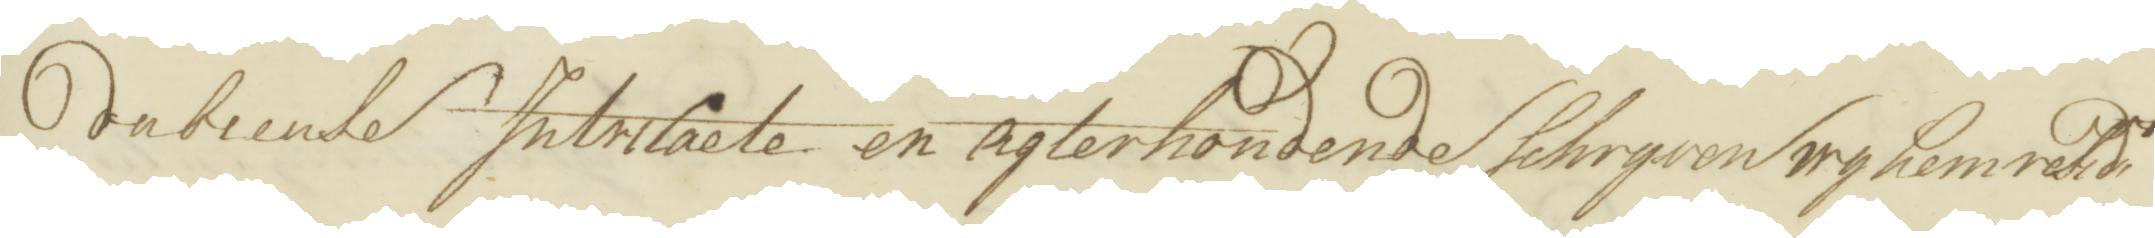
dubieuse Jntricaete en agterhoudende schryven wy hem resid„t
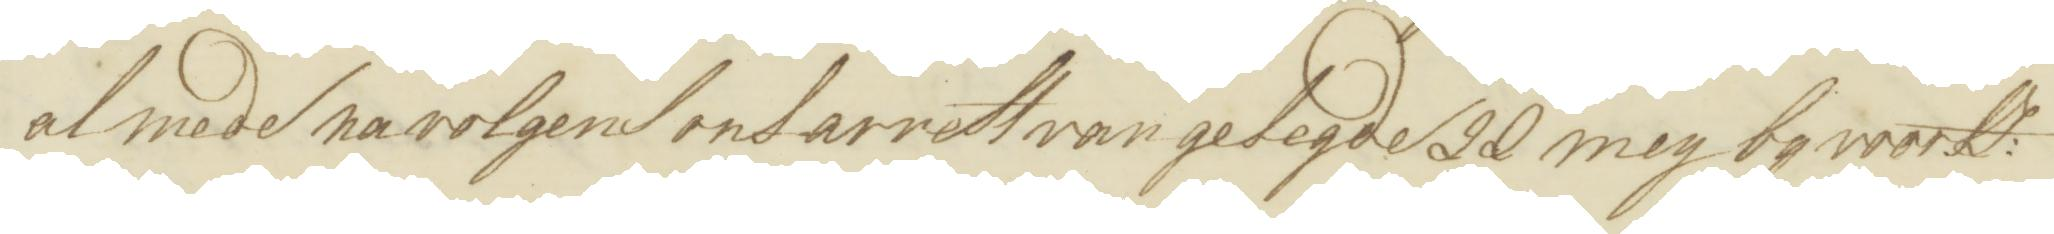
al mede na volgens ons arrest van gesegde 22 mey by voorsz:
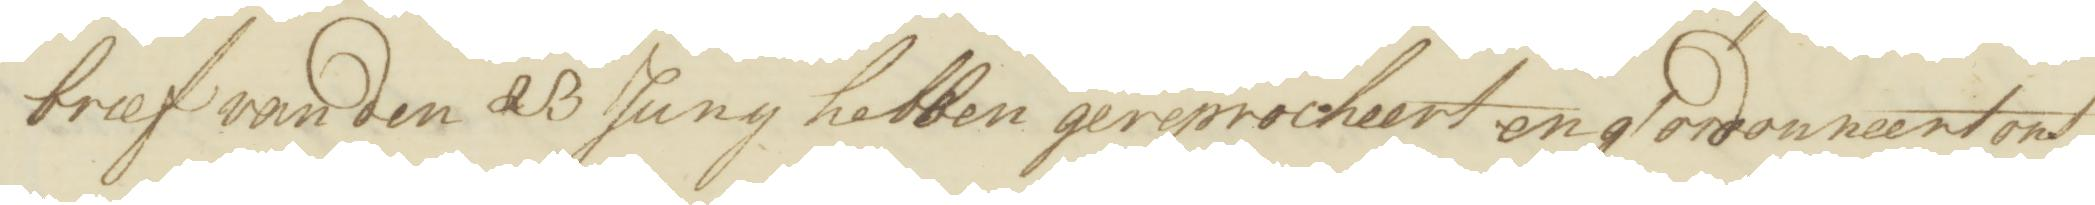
brief van den 23 Juny hebben gereprocheert en g’ordonneert ons
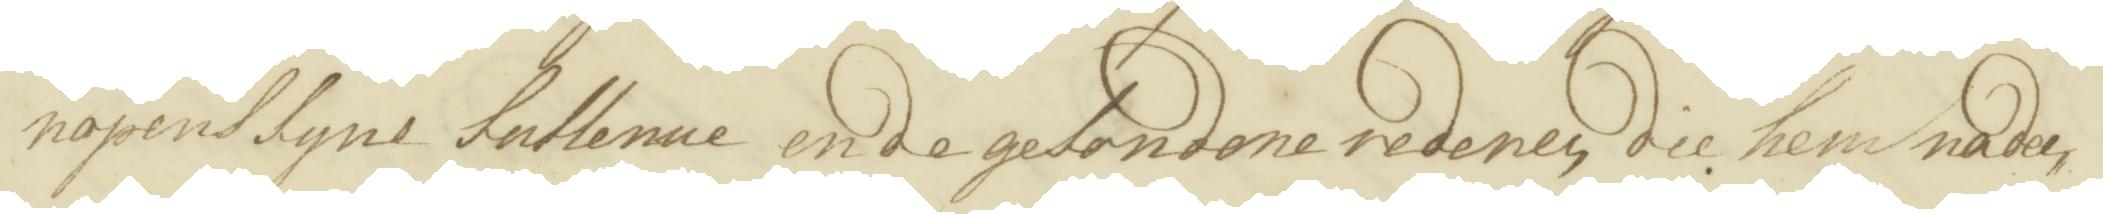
nopens syne sustenue en de gesondone redenen die hem nadee„
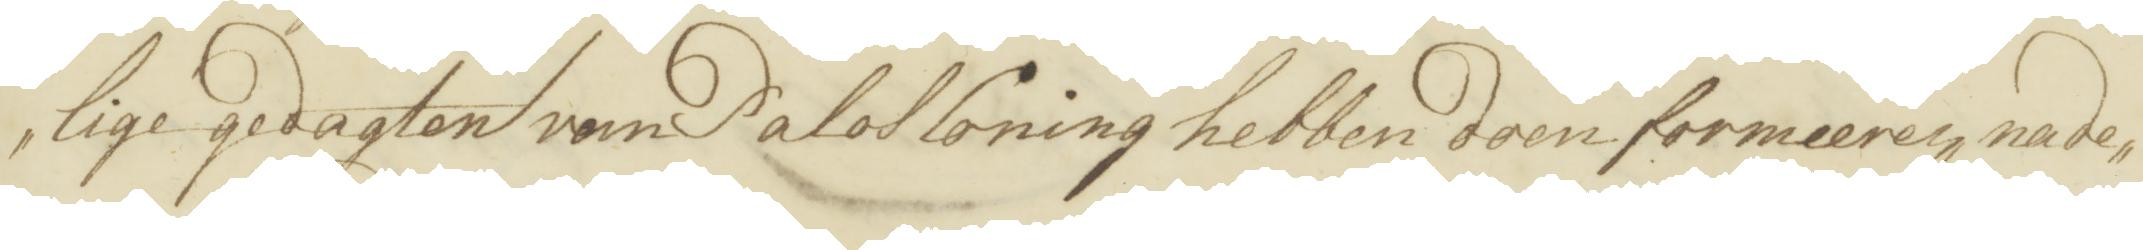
„lige gedagten van Palos Coning hebben doen formeeren, nade„
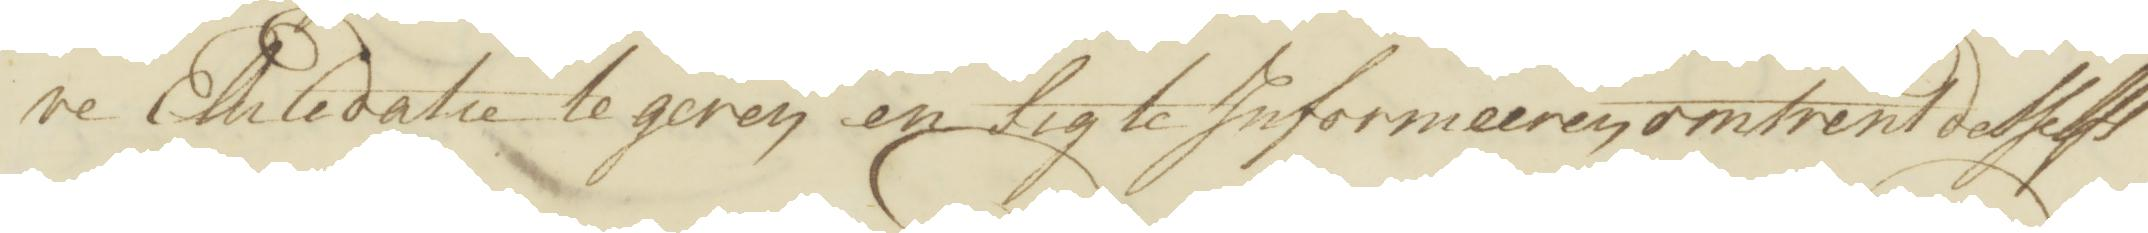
re Elucidatie te geven en sig te Jnformeeren omtrent desselfs
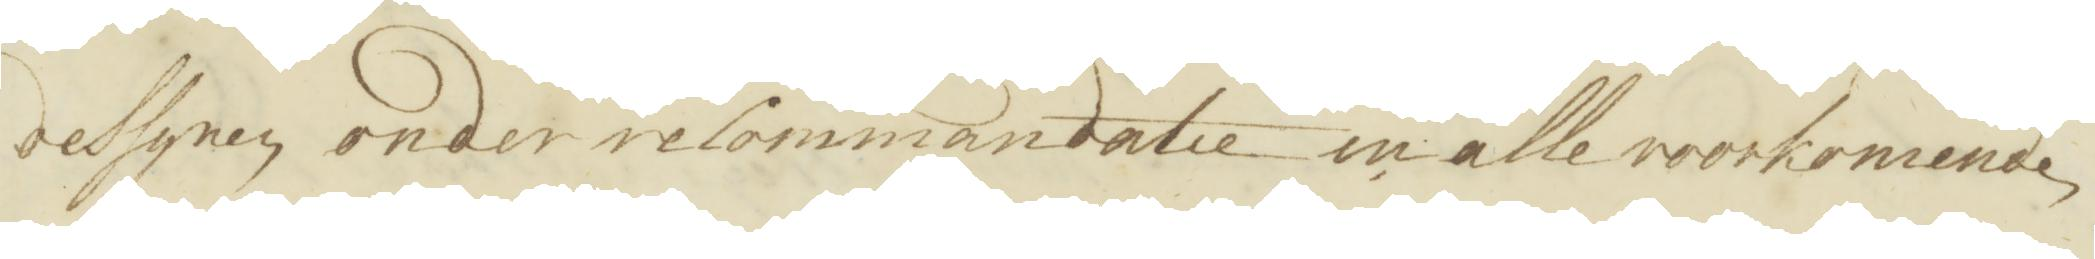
dessynen onder recommandatie in alle voorkomenden
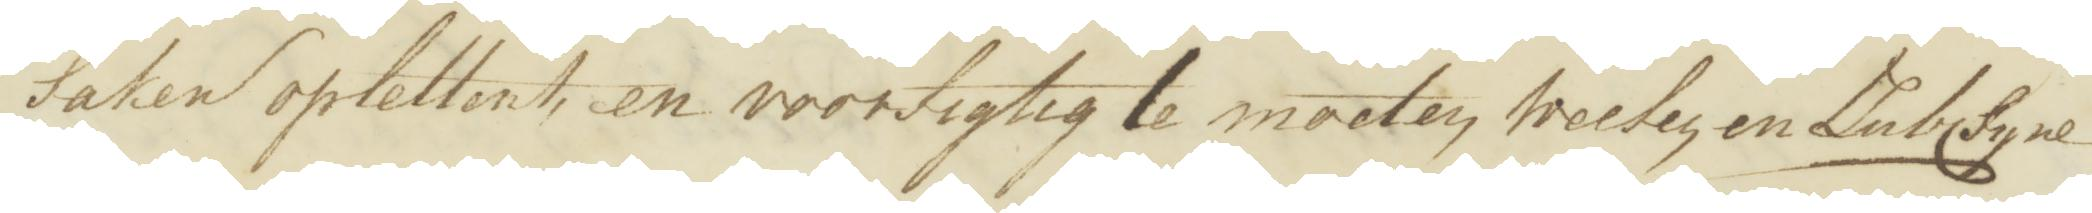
saken oplettent, en voorsigtig te moeten weesen en zulx syne
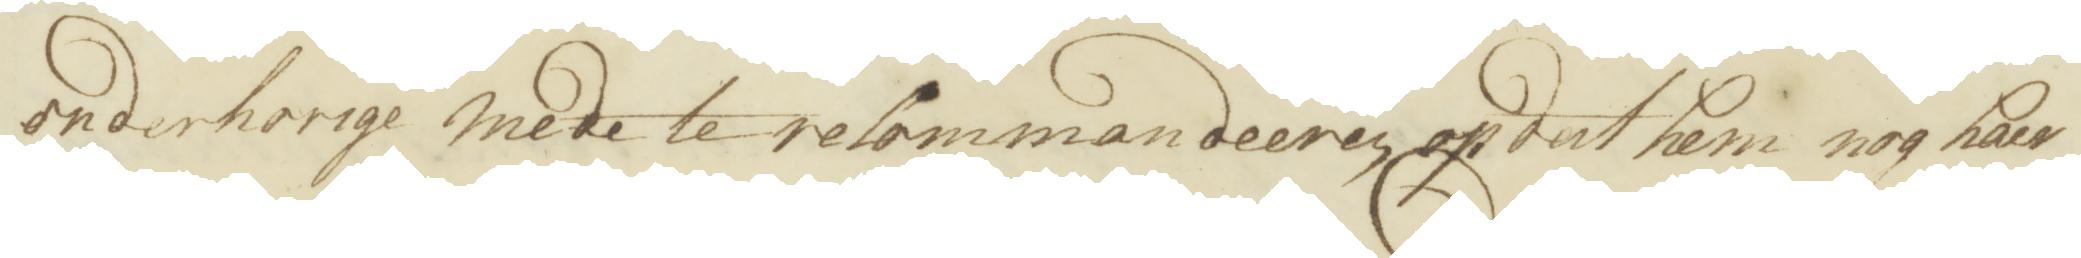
onderhorige mede te recommandeeren op dat hem nog haer
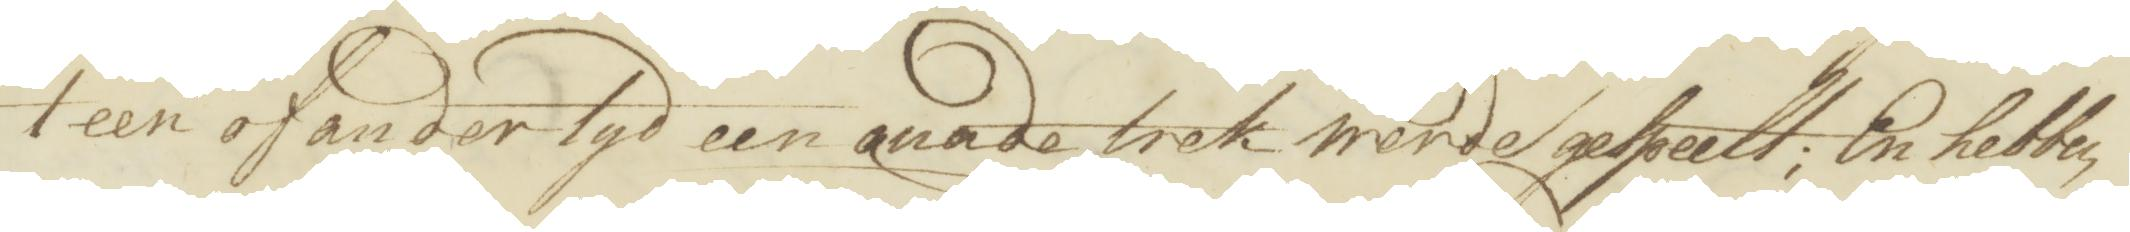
't een of ander tyd een quade trek werde gespeelt; En hebben
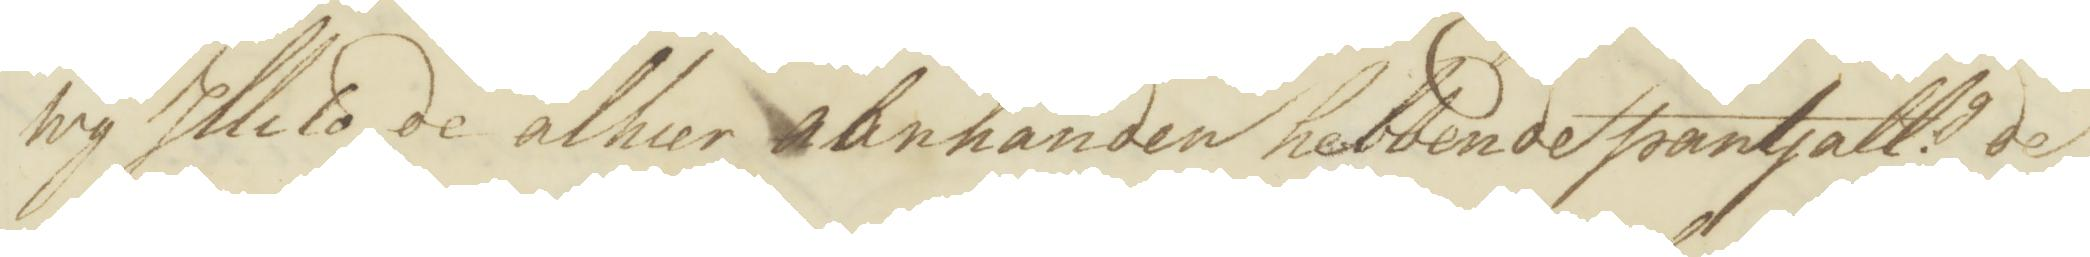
wy Jllico de alhier aanhanden hebbende pantjall:g de
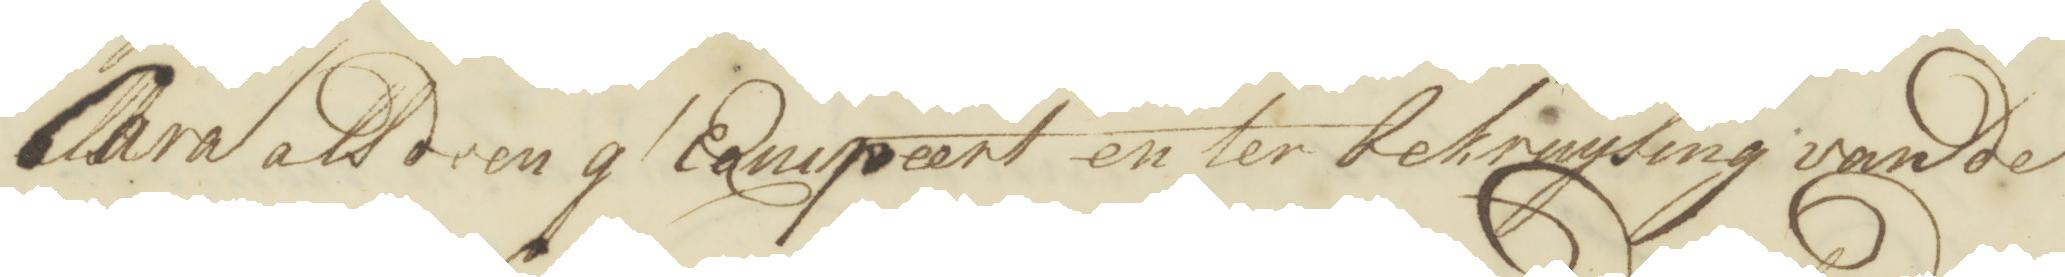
Clara als doen g’Equipeert en ter bekruysing van de
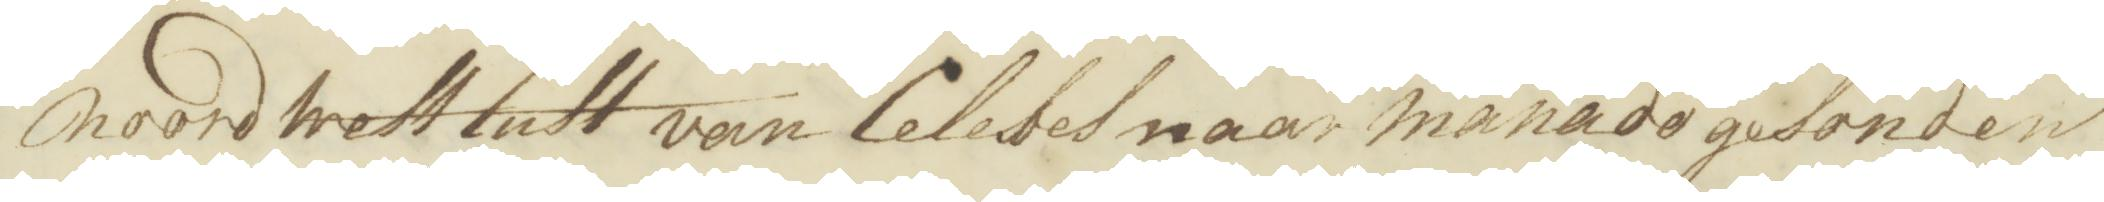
noord west Cust van Celebes naar manado gesonden
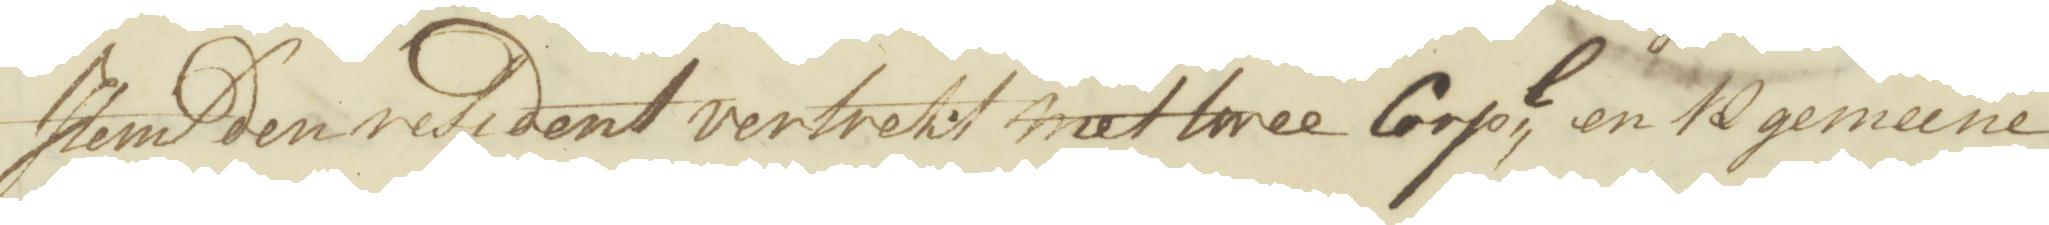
Jtem den resident vertrekt met twee Corp„l en 12 gemeene
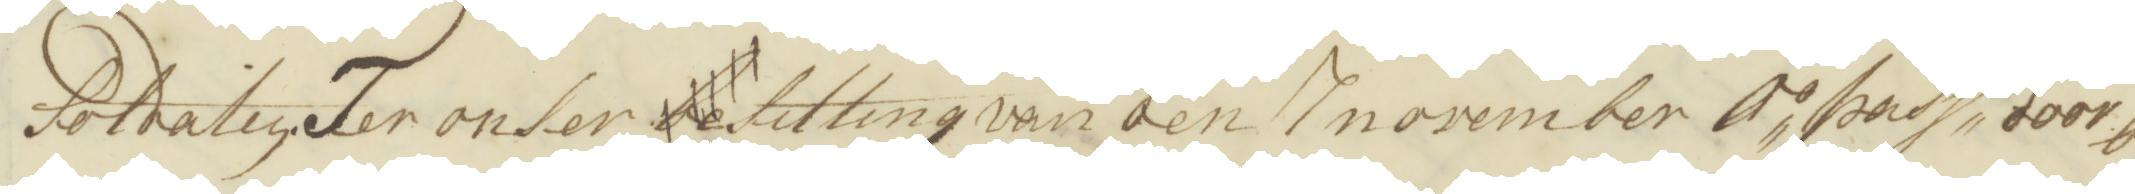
soldaten Ter onser besitting van den 7 november A„o pass„o door
